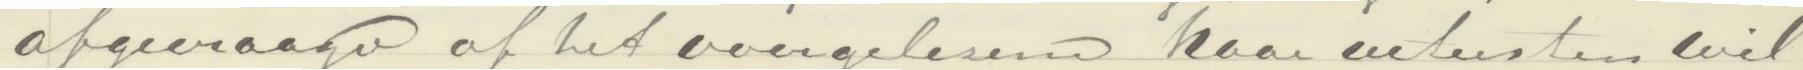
afgevraagd of het voergelezene haar uitersten wil
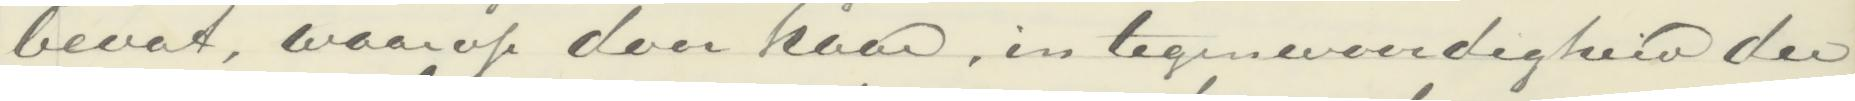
bevat, waarop door haar, in tegenwoordigheid der
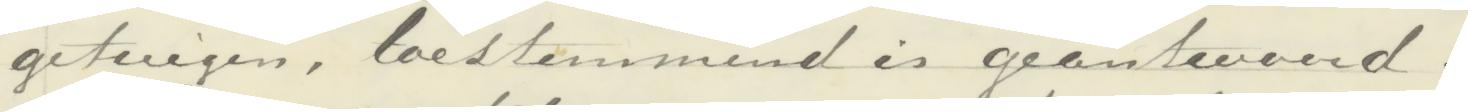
getuigen, toestemmend is geantwoord.
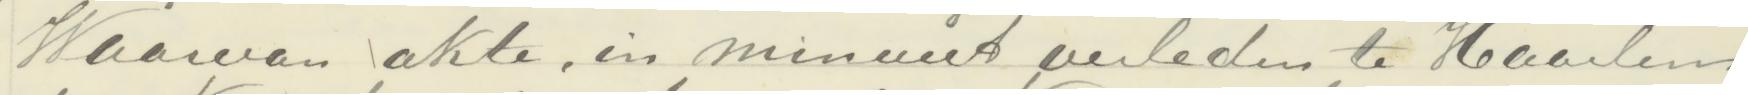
Waarvan akte, in minuut verleden te Haarlem
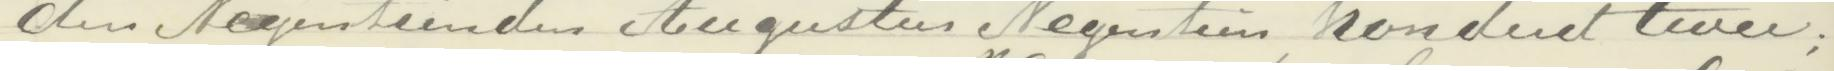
den Negentienden Augustus Negentien honderd twee;
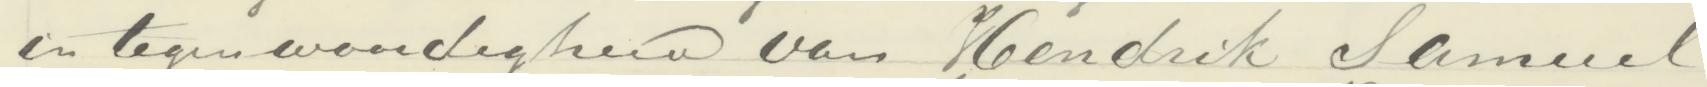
in tegenwoordigheid van Hendrik Samuel
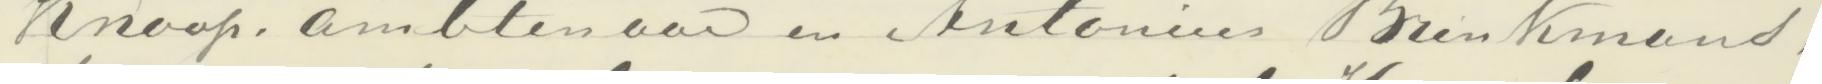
Knoop, ambtenaar en Antonius Brinkmans,
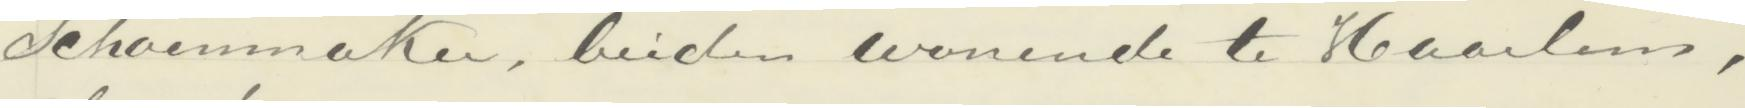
schoenmaker, beiden wonende te Haarlem,
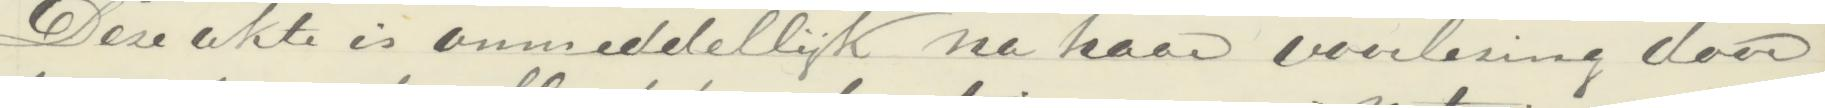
Deze akte is onmiddellijk na haar voorlezing door
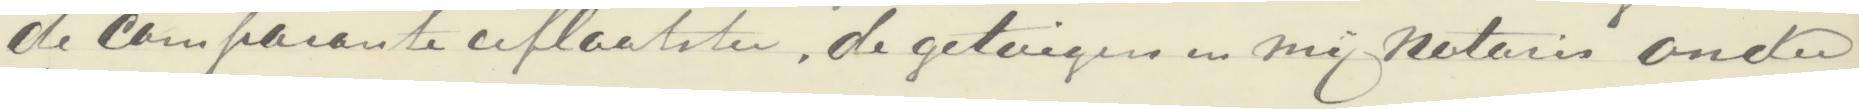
de comparante erflaatster, de getuigen en mij notaris onder=
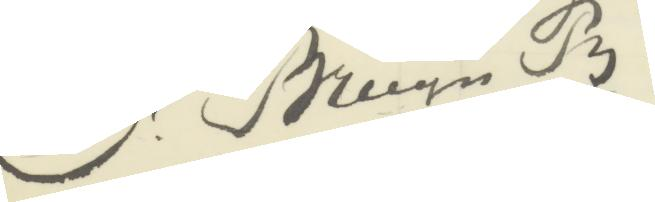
J. Bruyn Jz
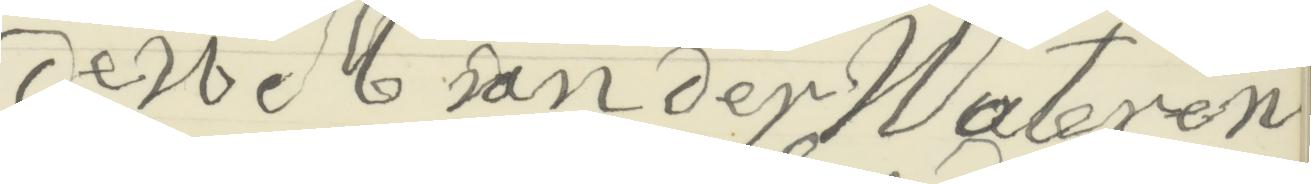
de W M van der Wateren
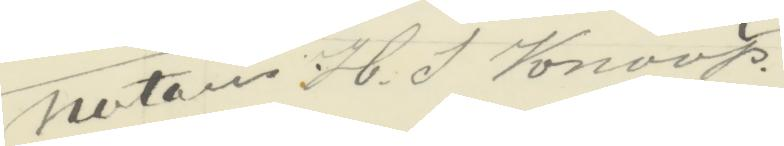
notaris H. S. Knoop
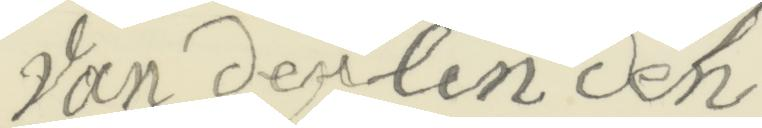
Van der lin den
